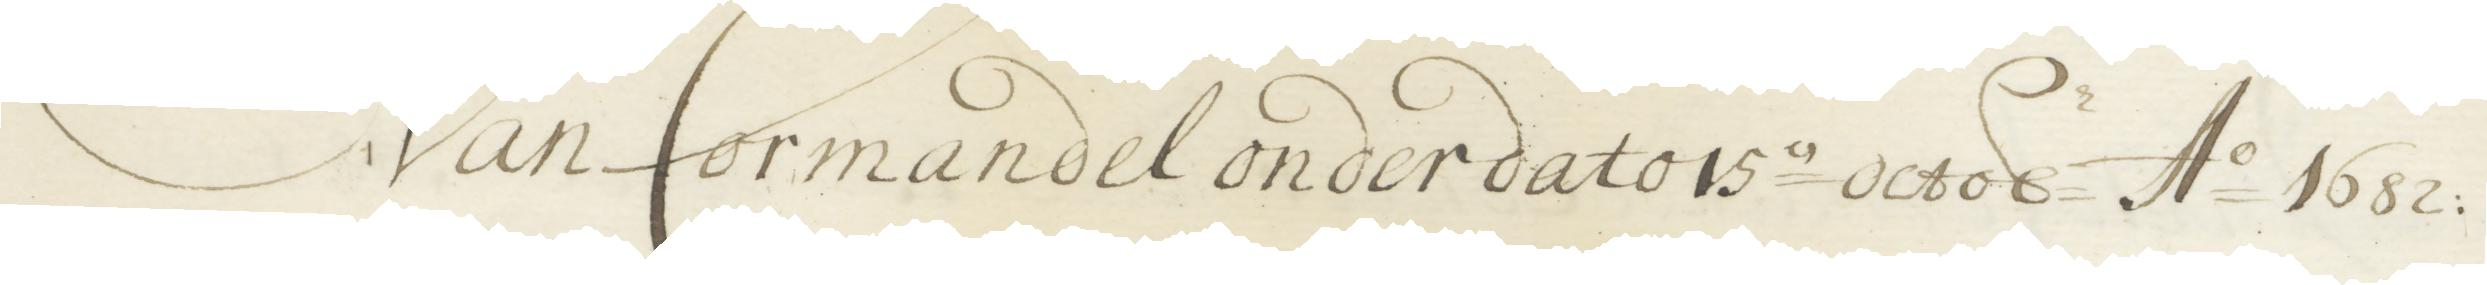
Van Cormandel onder dato 15=en octob=r A=o 1682:
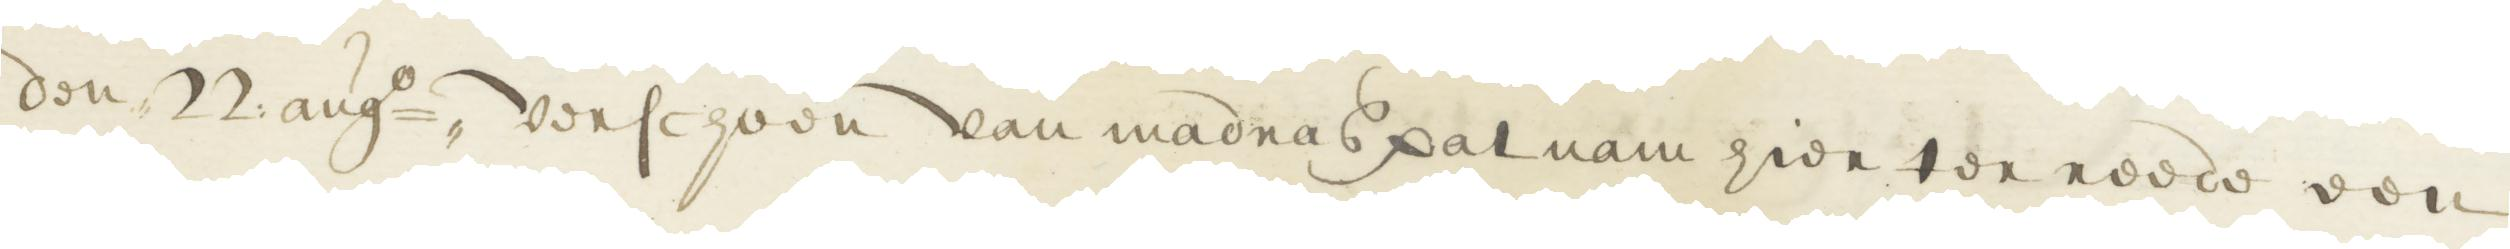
den „ 22: aug=o„ verscheen van madraspatnam hier ter reede een
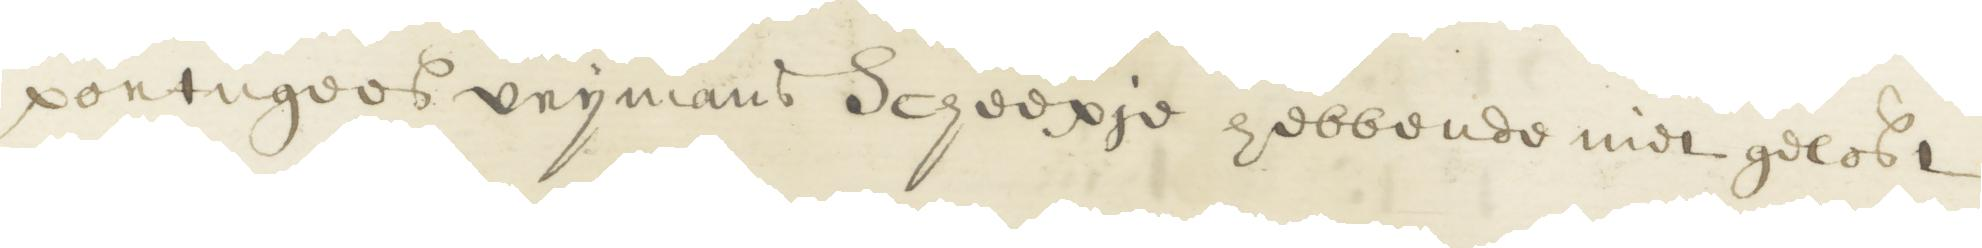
portugees vrijmans Scheepje hebbende niet gelost
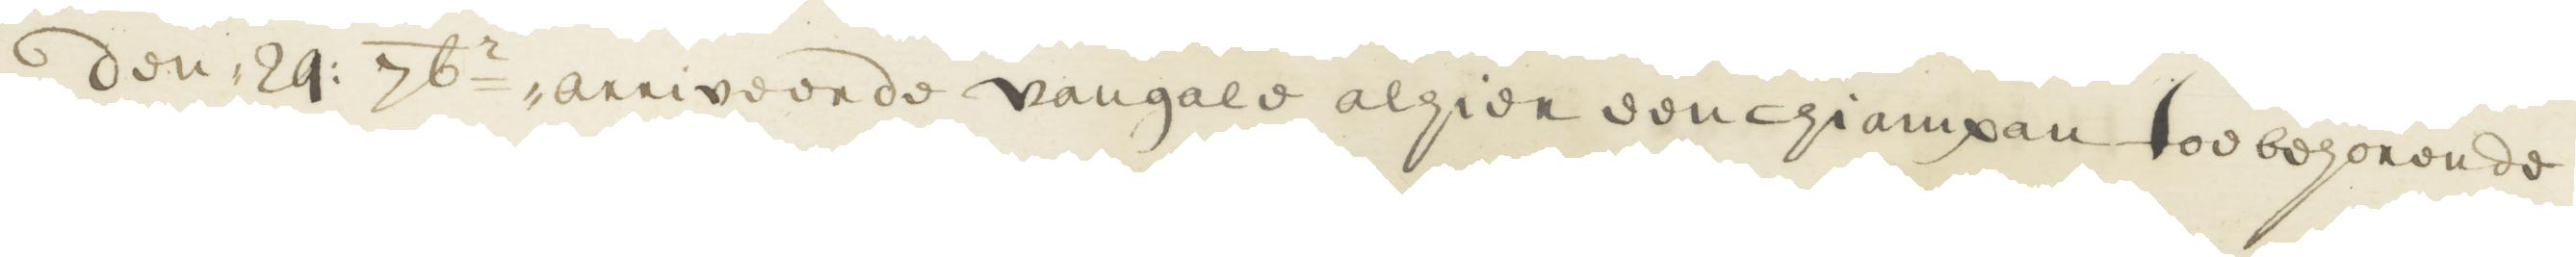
den „ 24: 7b=r „ arriveerde van gale alhier een chiampan toebehorende
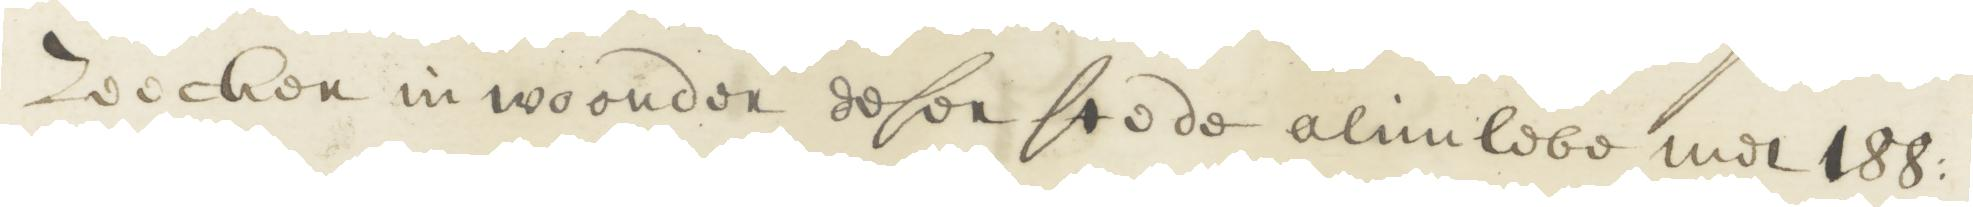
Zeecker in woonder deser stede alimlebe met 188:
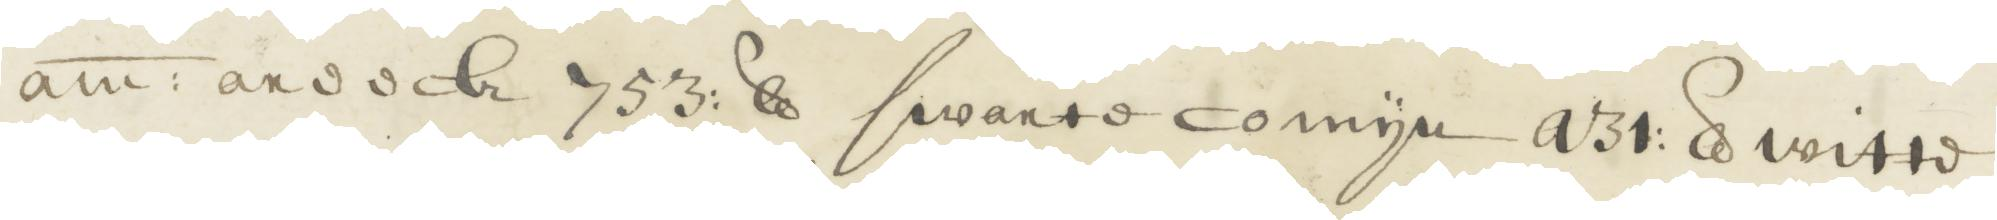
am: areeck 753: lb swarte comijn 431: lb witte
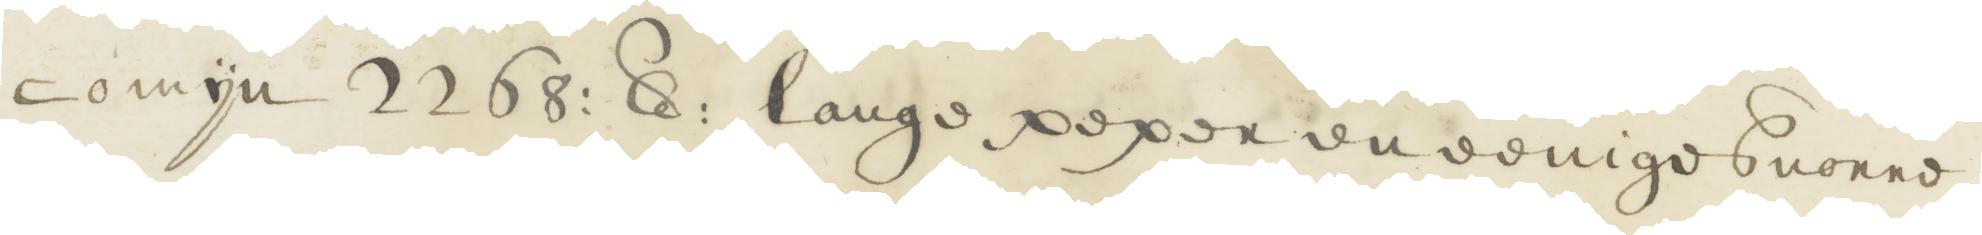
comijn 2268: lb: lange peper en eenige snorre
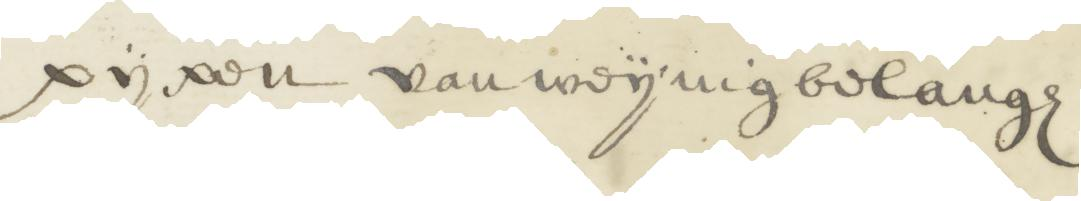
pijpen van weijnig belangh
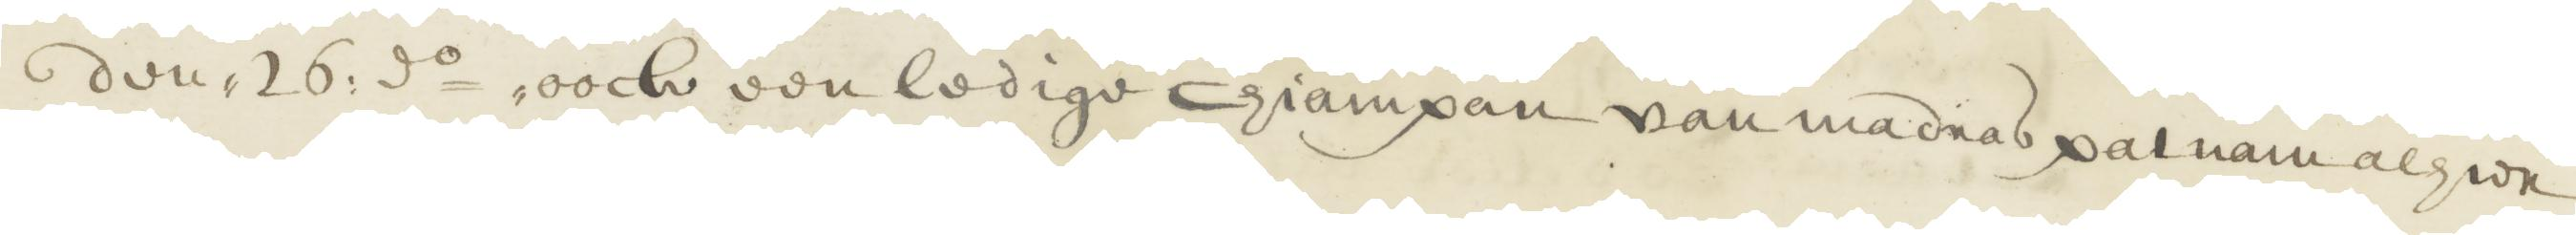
den „ 26: d=o, „oock een ledige chiampan van madraspatnam alhier
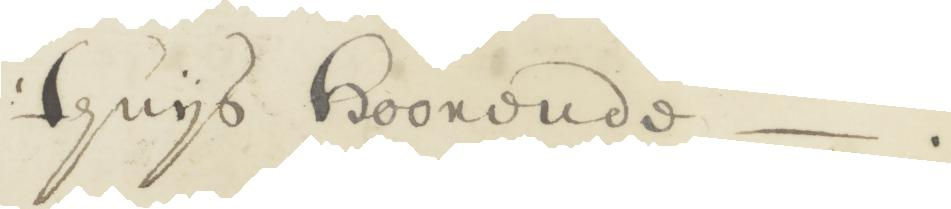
'thuijs Hoorende —.
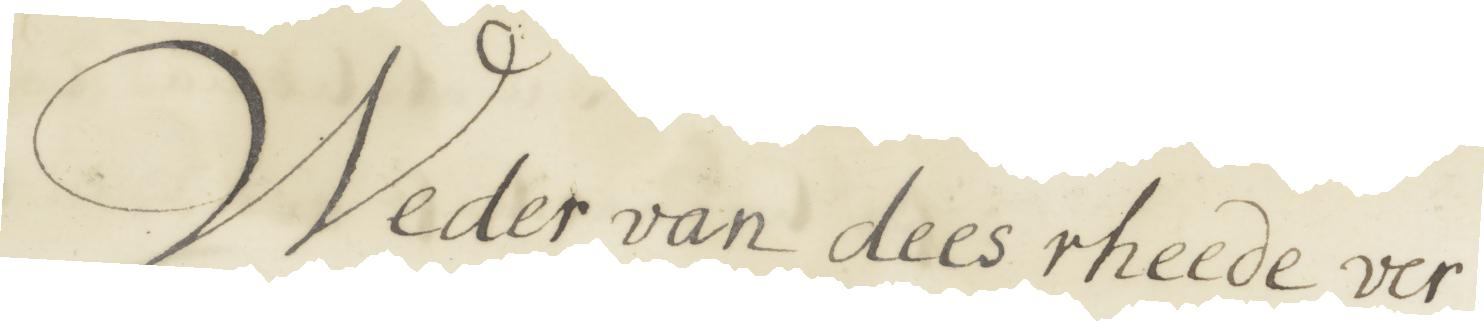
Weder van dees rheede ver
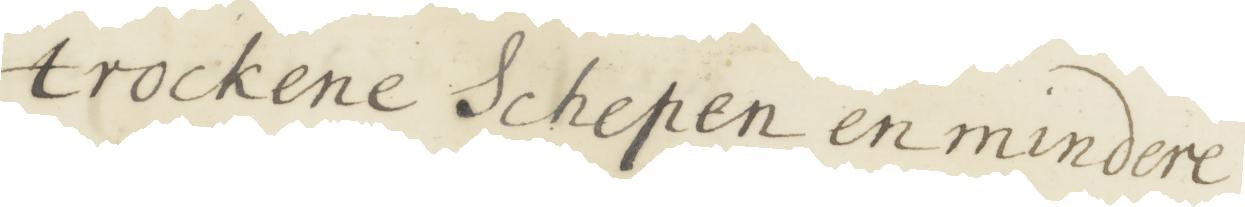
trockene Schepen en mindere
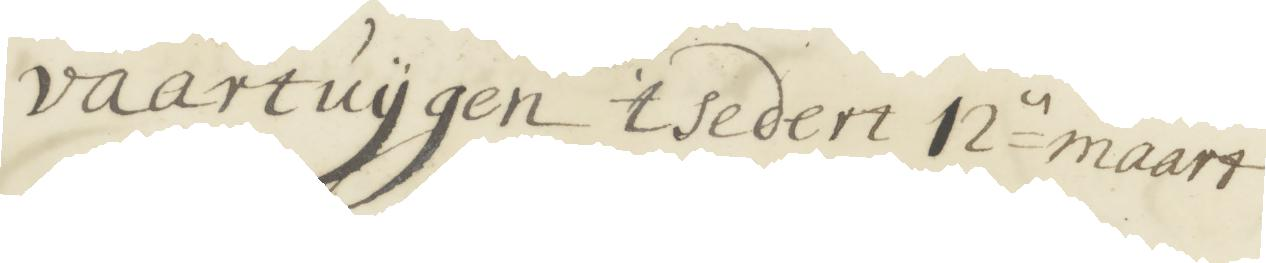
vaartuijgen ’t sedert 12=e maart
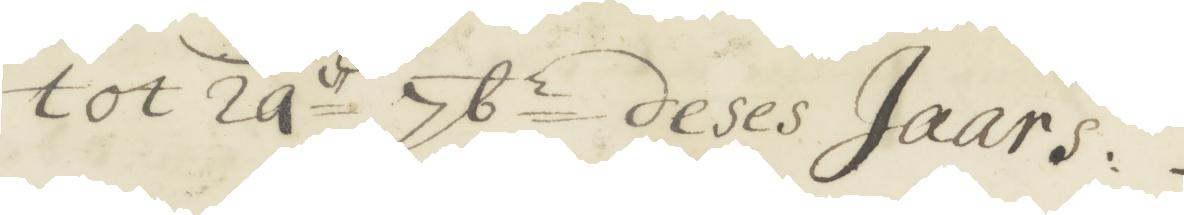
tot 24=e 7b=r deses Jaars:
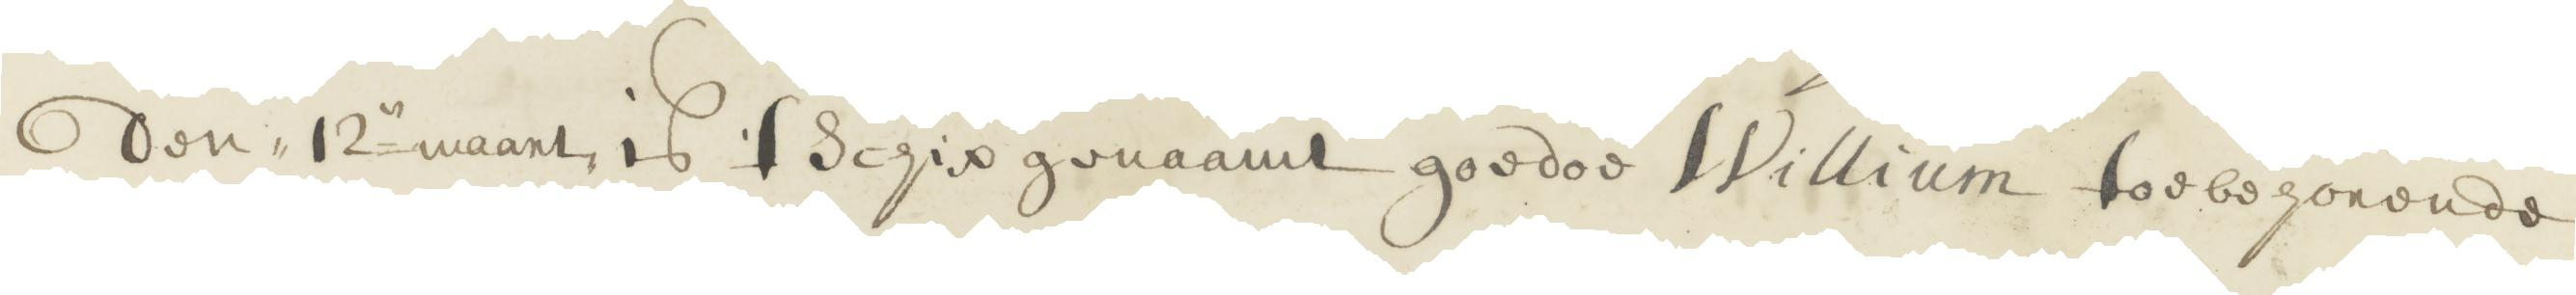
den „ 12=en maart, is ’t schip genaamt goedoe Willium toebehorende
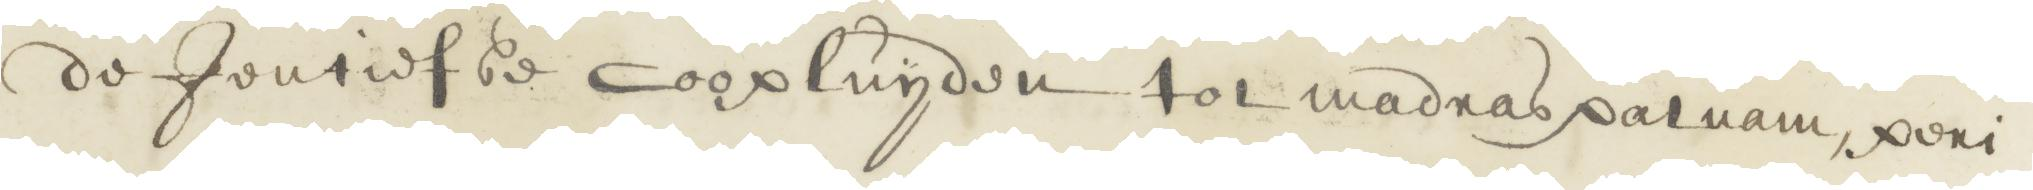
de Jentiefse coopluijden tot madraspatnam, peri
